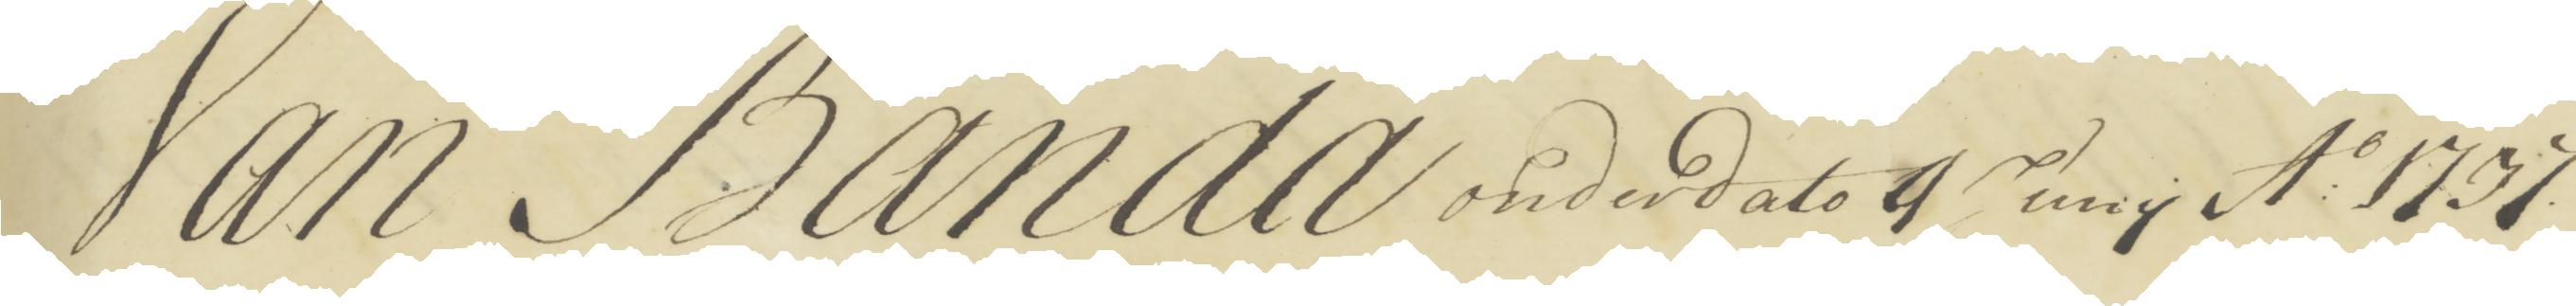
Van Banda onder dato 4 Junij A:o 1737.
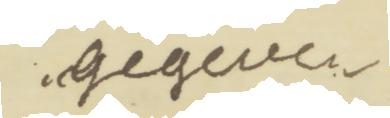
„gegeven
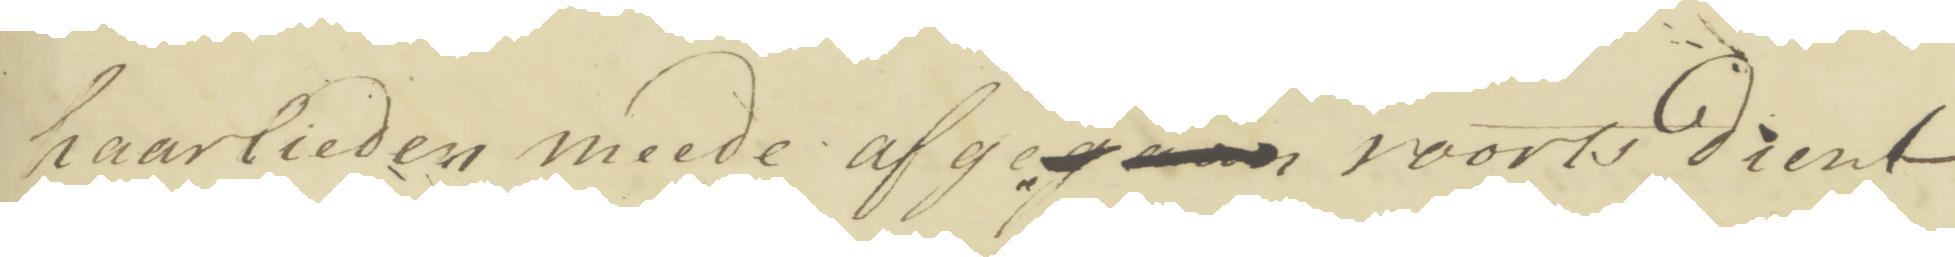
haarlieden meede afgegaan voorts dient
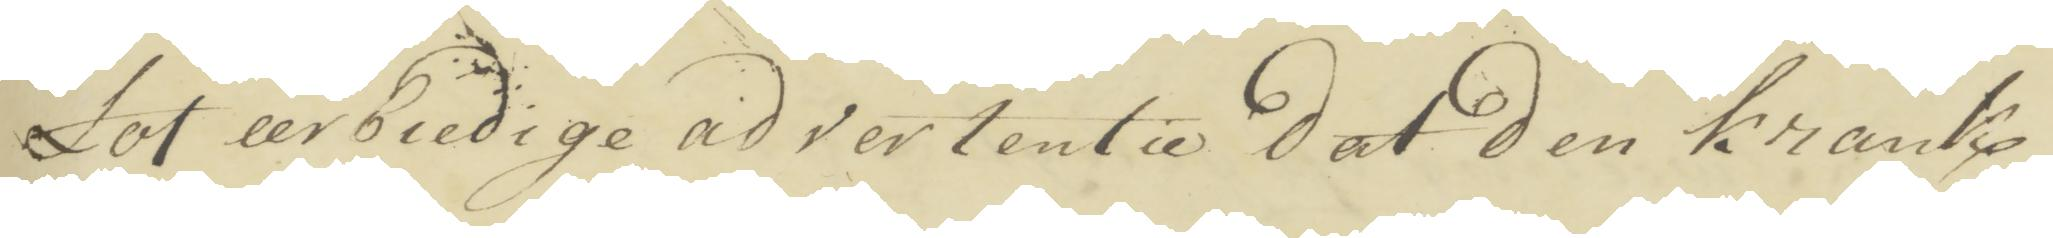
tot eerbiedige advertentie dat den krank
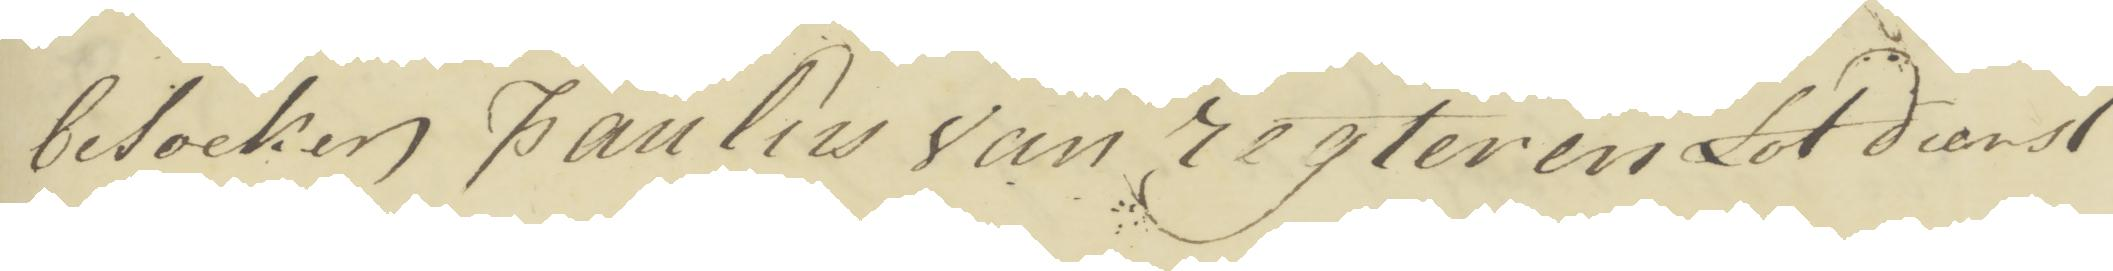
besoeken Paulus van Regteren tot dienst
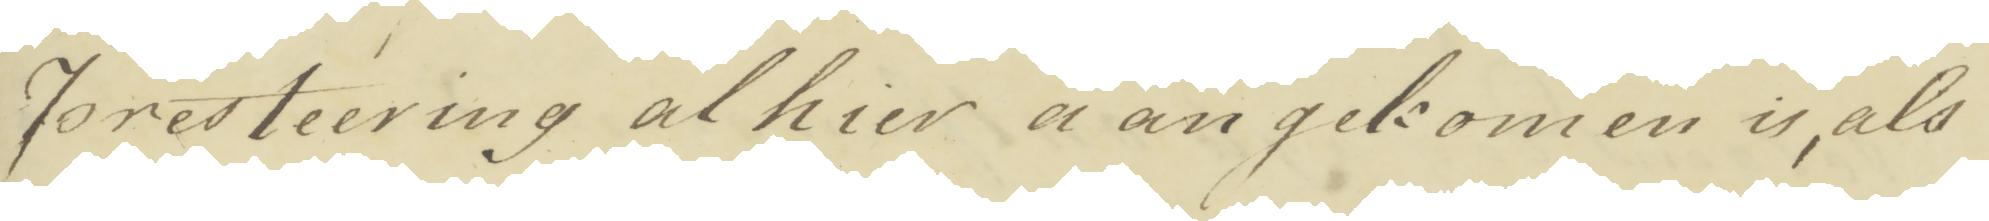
Presteering alhier aangekomen is, als
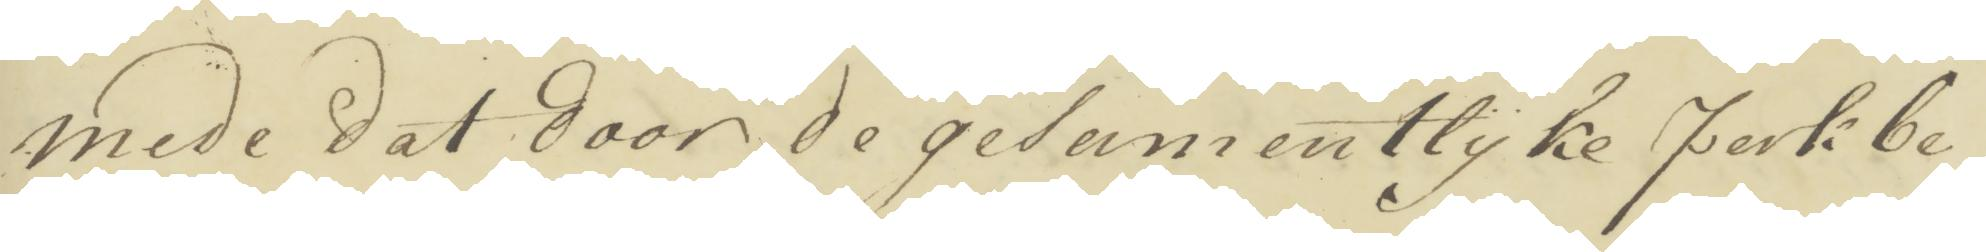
mede dat door de gesamentlijke Perk be
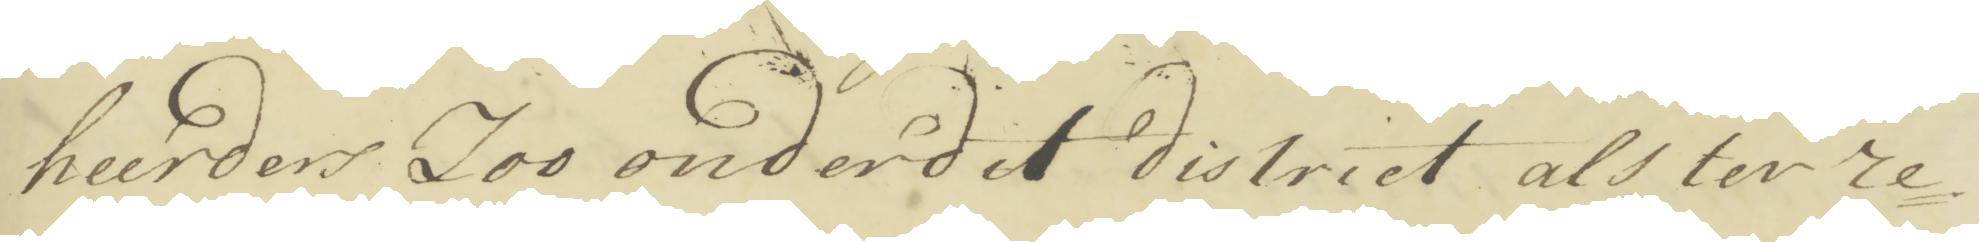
heerders zoo onder dit district als ter re„
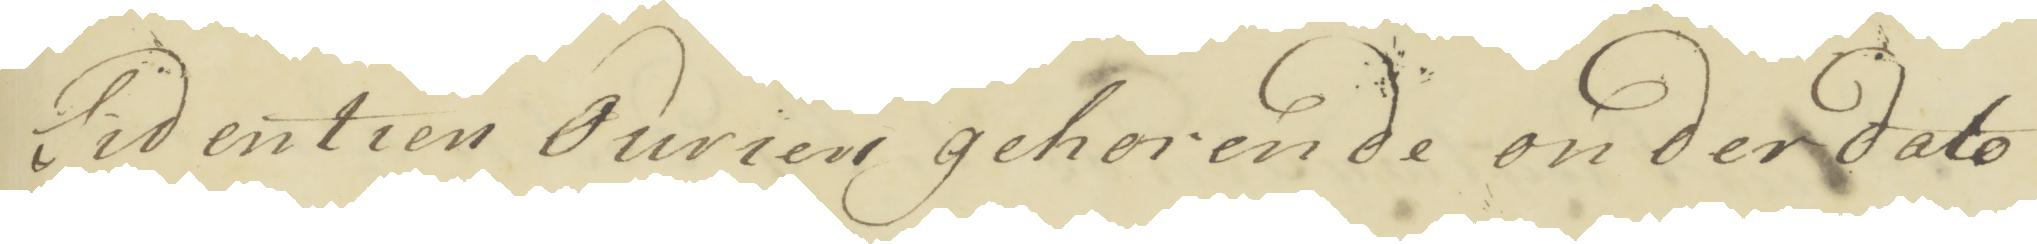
sidentien Ourier gehorende onder dato
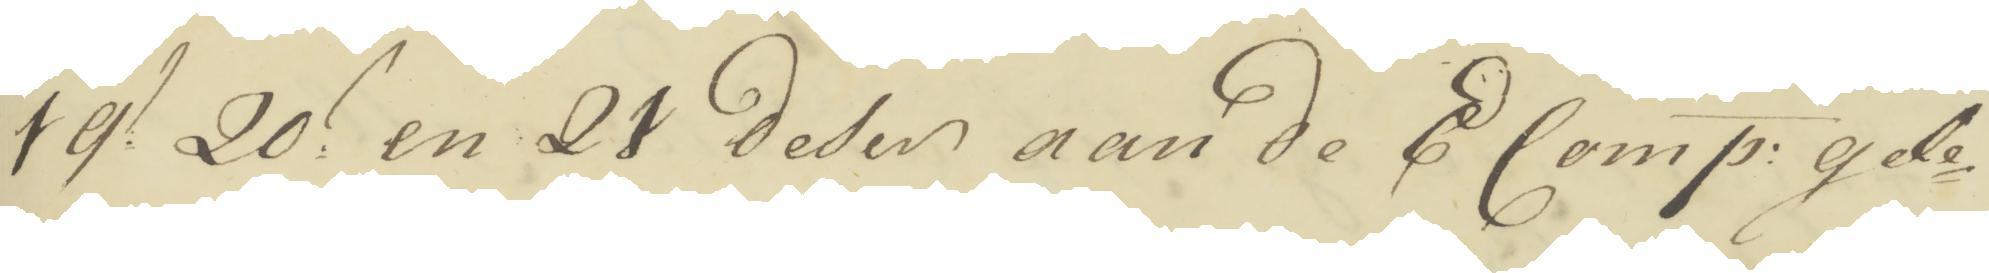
19:' 20:' en 21 deser aan de E Comp: gele„
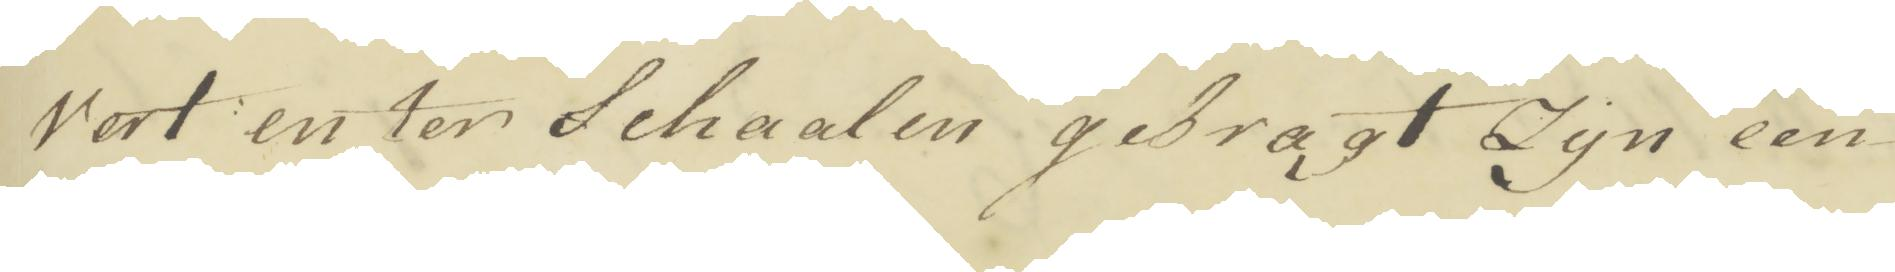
vert: en ter schaalen gebragt zijn een
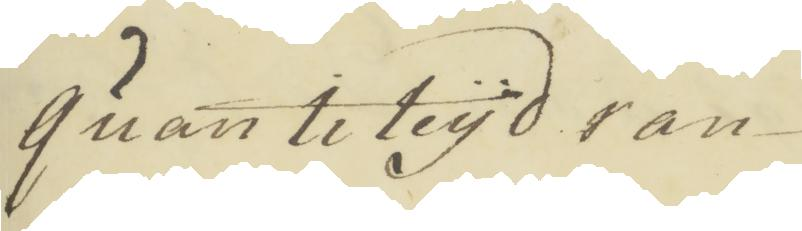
quantiteijd van
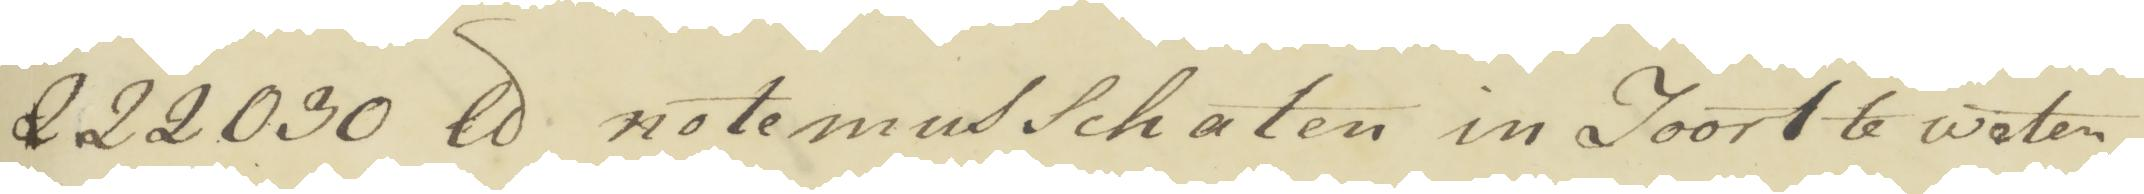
222030 ld notemusschaten in Zoort te weten
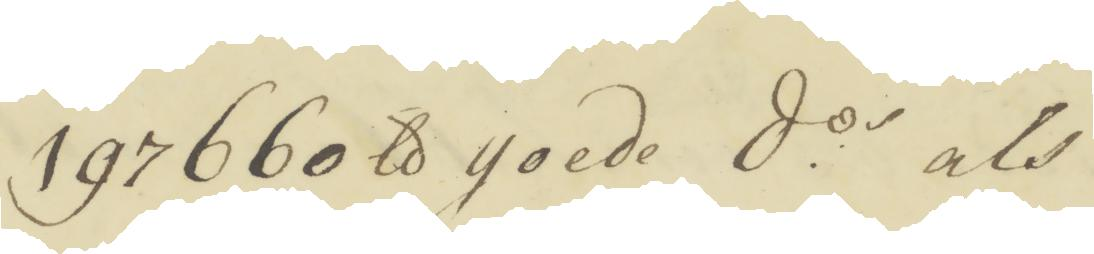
197660 ld goede d.os als
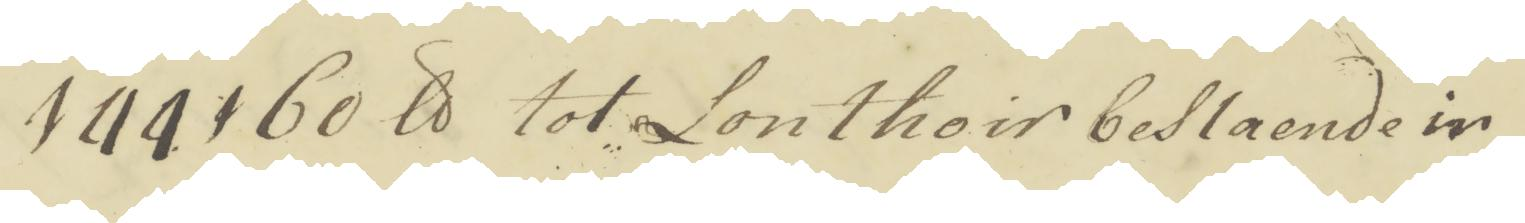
144160 lb tot Lonthoir bestaende in
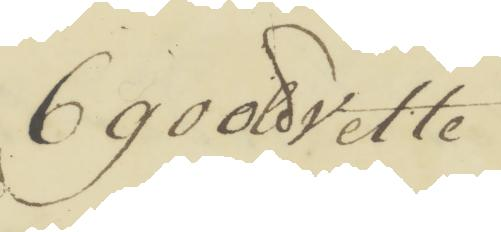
600 ld vette
